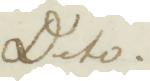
Dito. . . . . . . . . .
